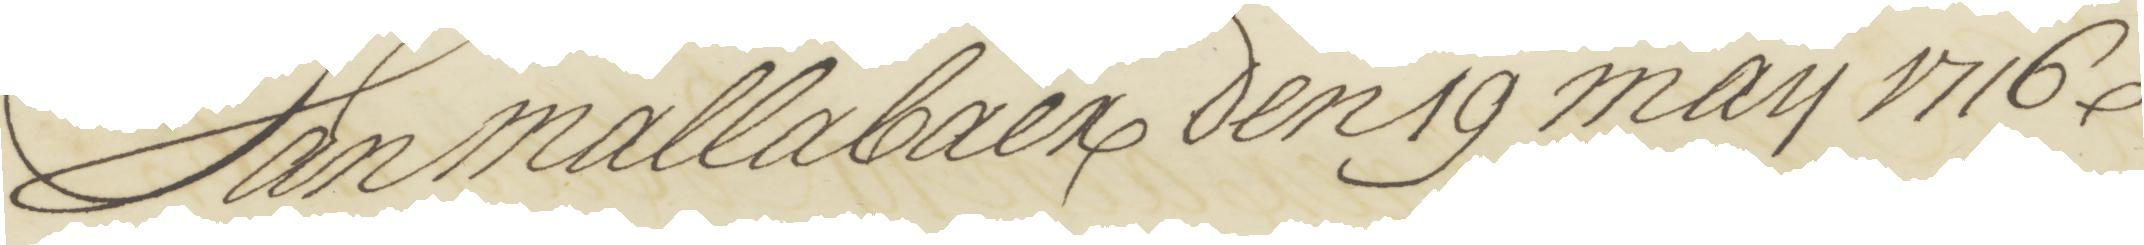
Van mallabaer den 19 maij 1716–
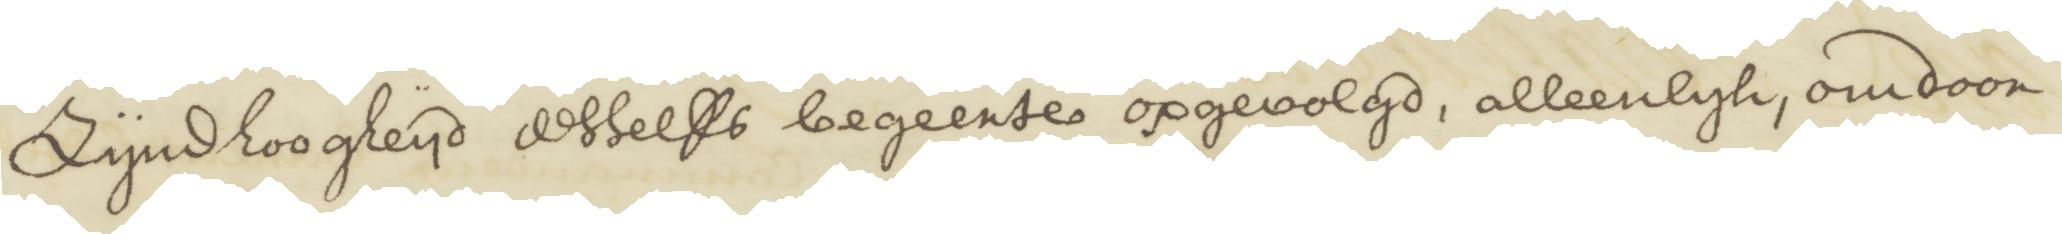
Zijne hoogheijd desselfs begeerte opgevolgd, alleenlijk, om door
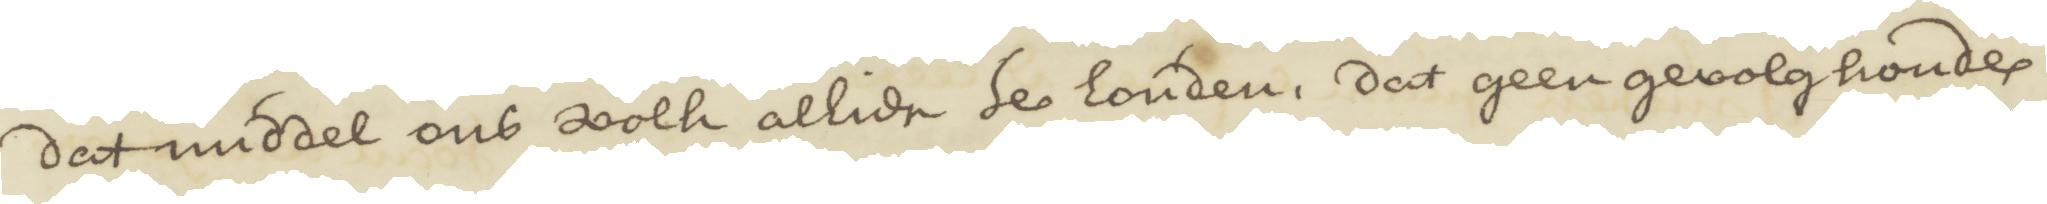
dat middel ons volk alhier te houden, dat geen gevolg konde
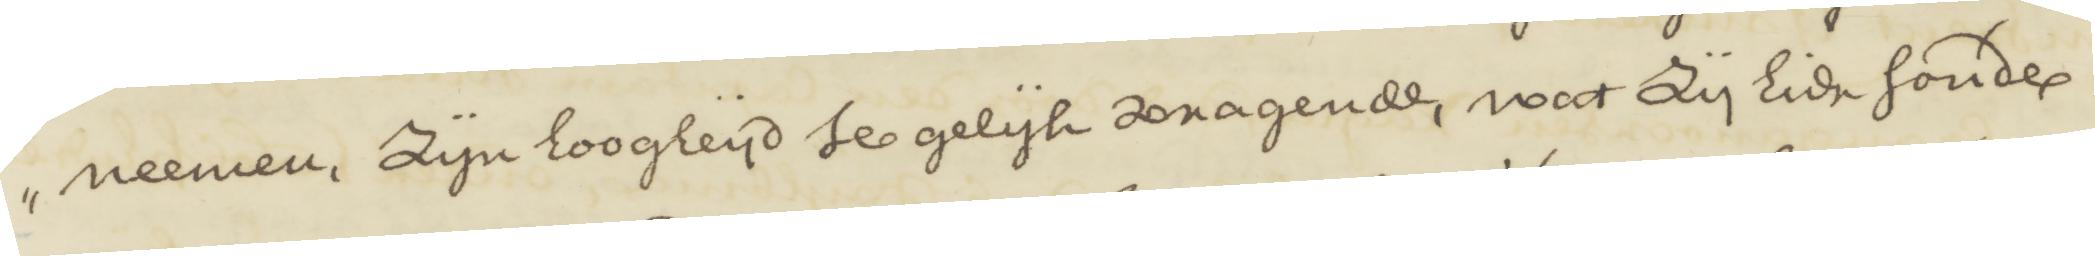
„ neemen, zijn hoogheijd te gelijk vragende, wat zij hier soude
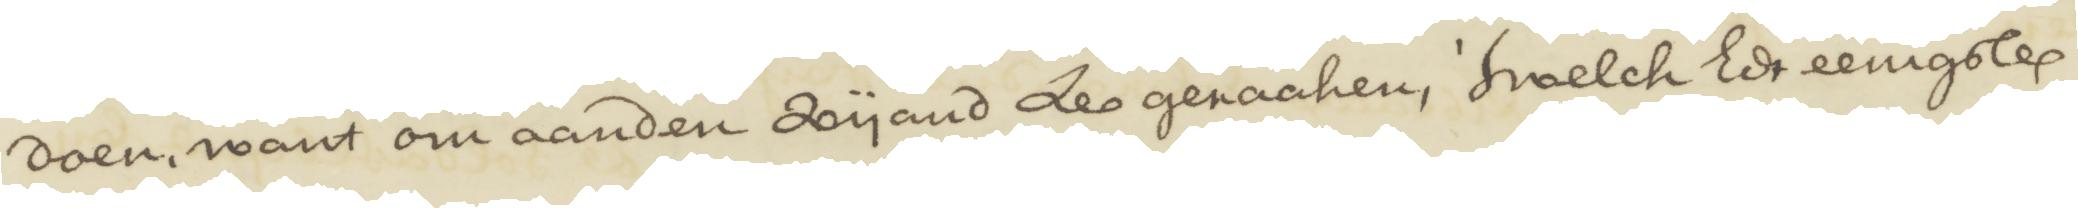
doen, want om aan den vijand te geraaken, 'twelck het eenigste
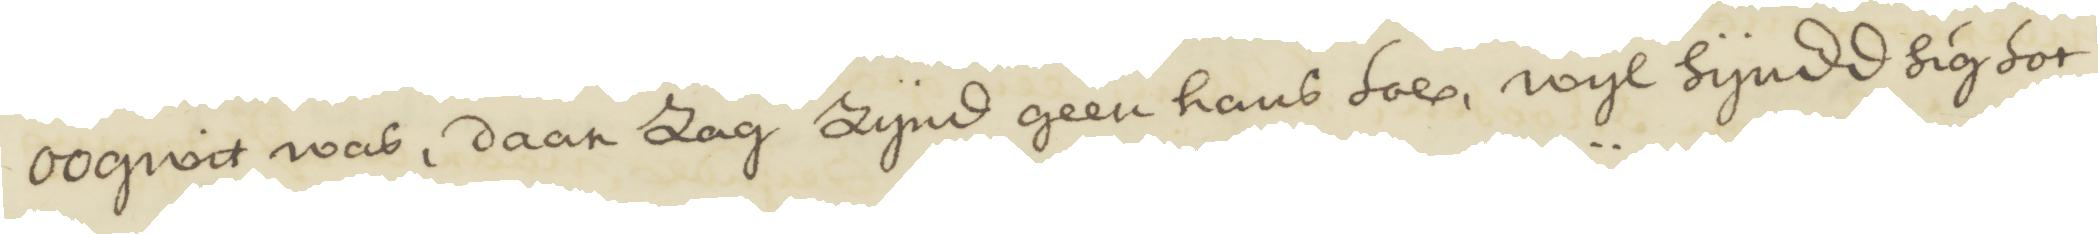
oogwit was, daar zag zijne geen kans toe, wijl sijn EE sig tot
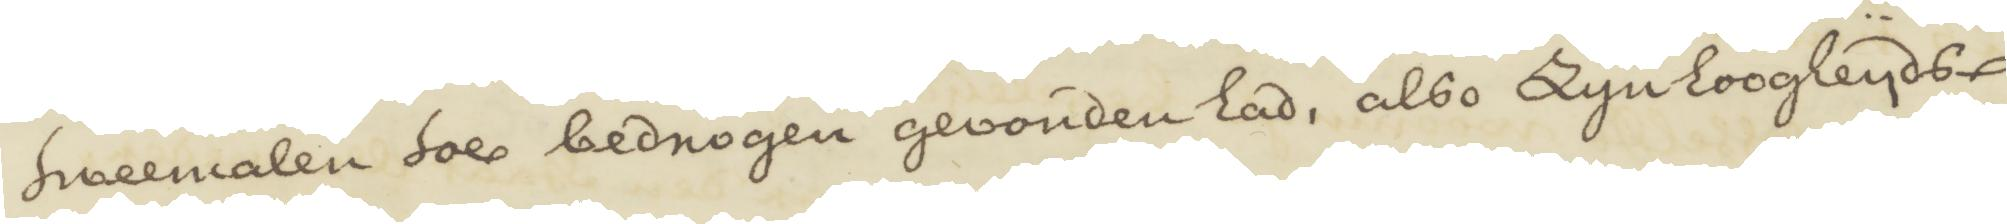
tweemalen toe bedrogen gevonden had, also zijn hoogheijds–
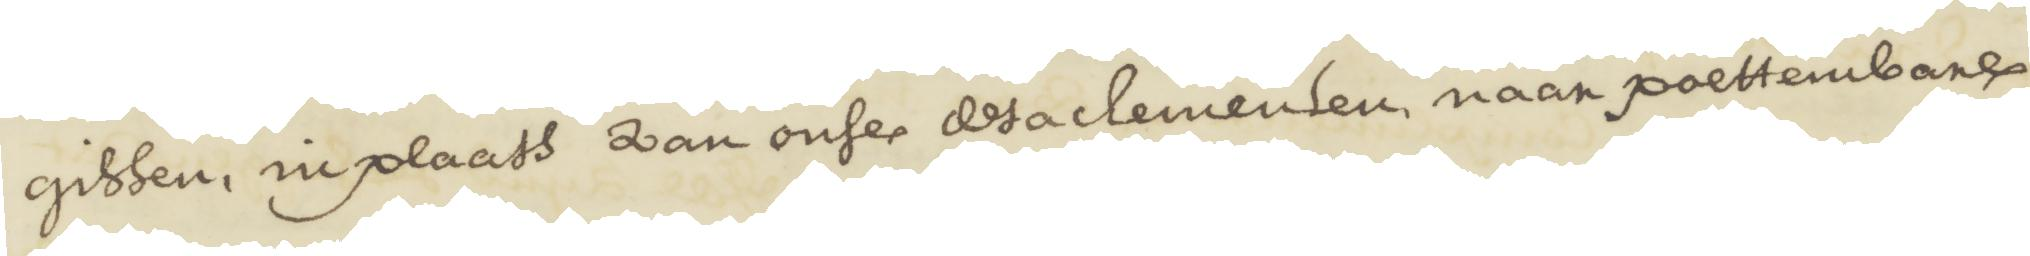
gissen, in plaats van onse detachementen, naar poettembare
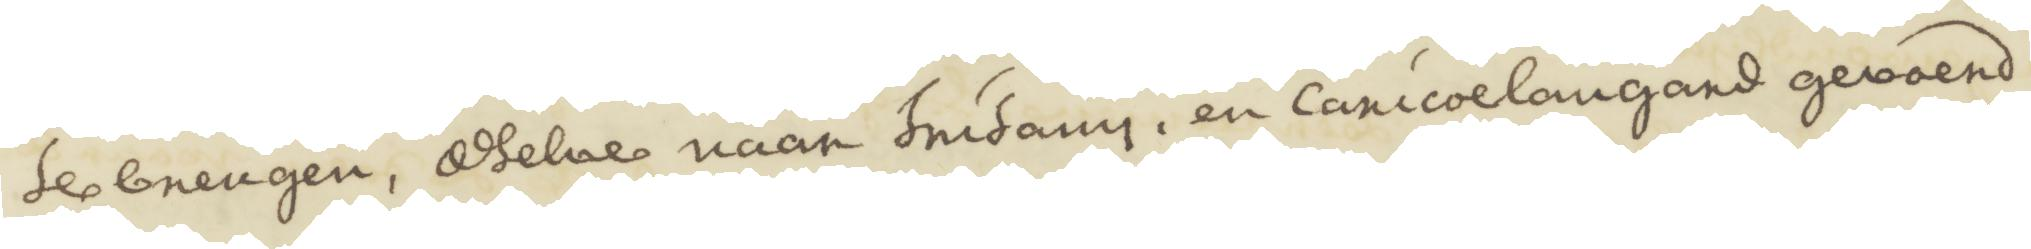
te brengen, deselve naar Tritanij, en caricollangare gevoerd
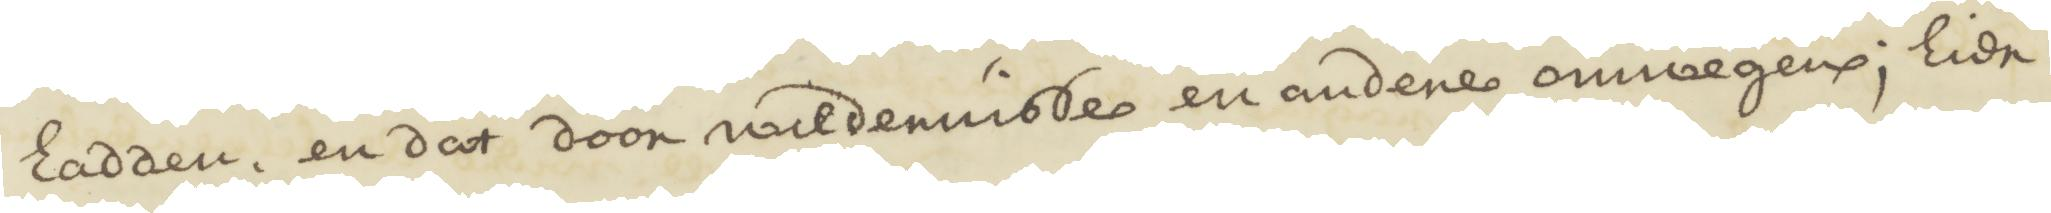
hadden, en dat door wildernisse en andere omwegen; hier
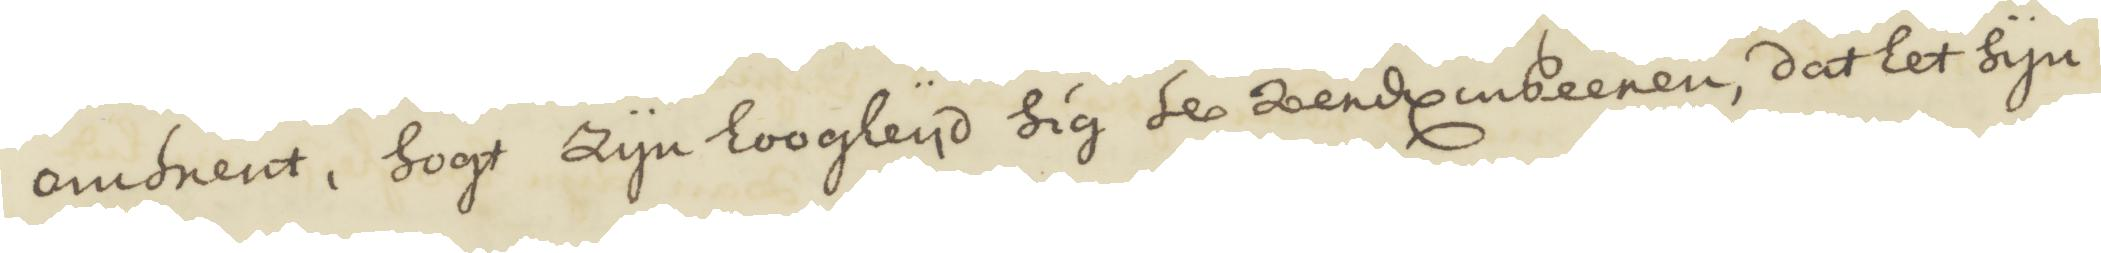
omtrent, sogt zijn hoogheijd sig te verexcuseeren, dat het sijn
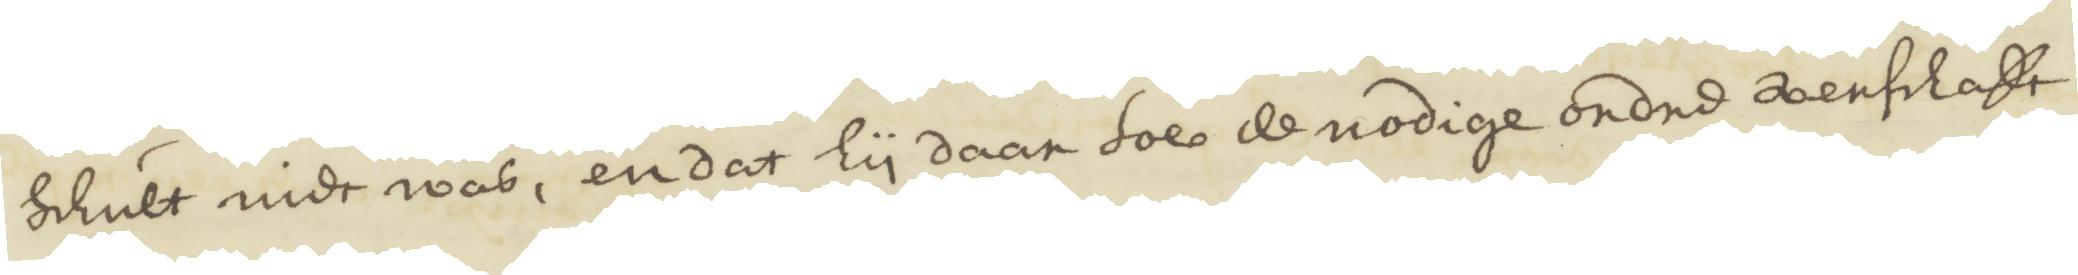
schult niet was, en dat hij daar toe de nodige ordre verschaft
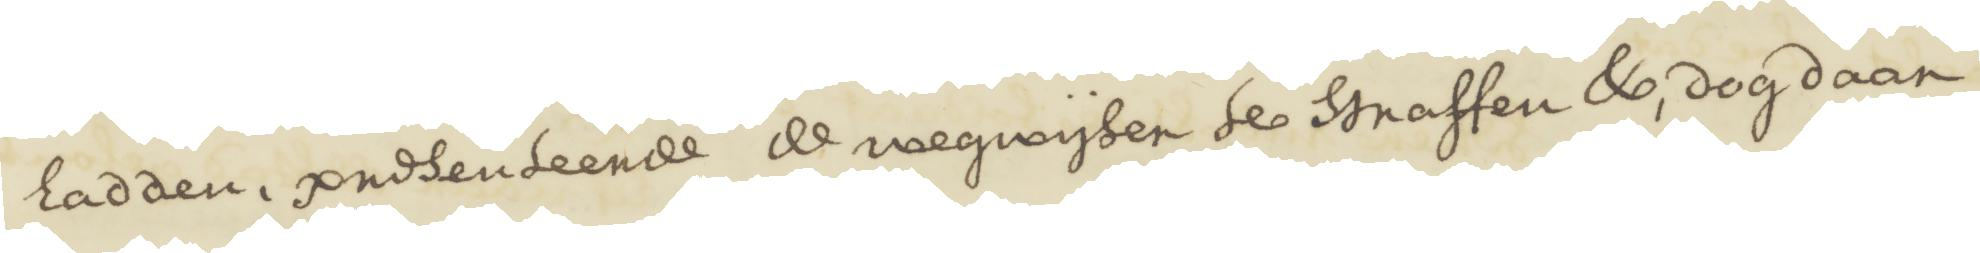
hadden, presenteerde de wegwijser te straffen &, dog daar
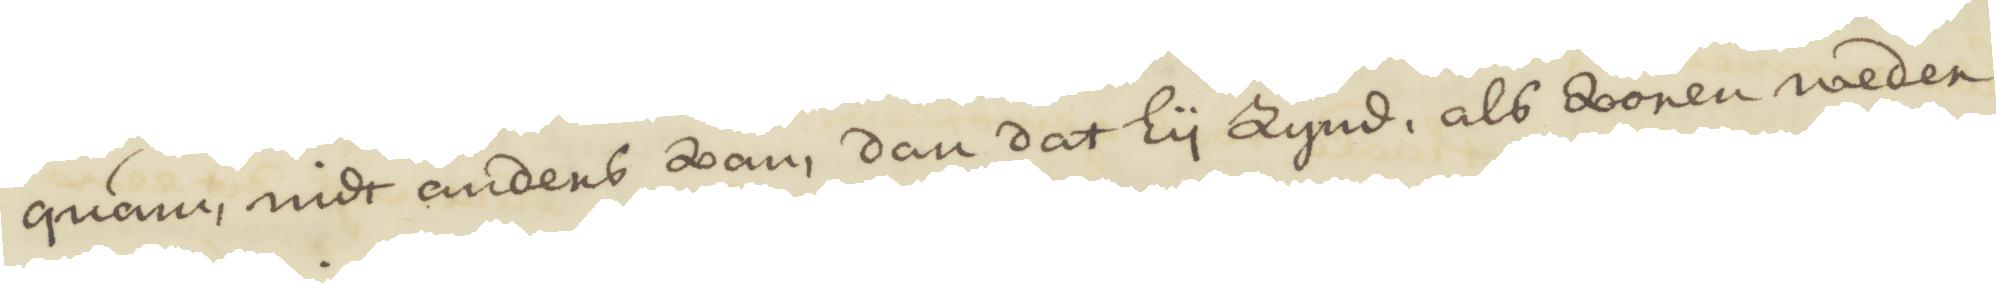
quam, niet anders van, dan dat hij zijne, als voren weder
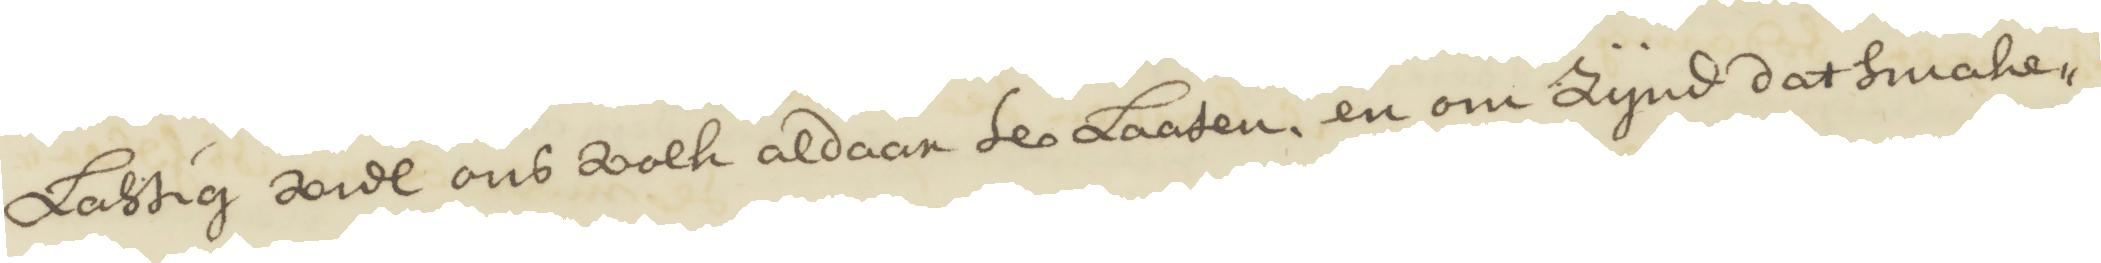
Lastig viel ons volk aldaar te Laaten, en om zijne dat smake„
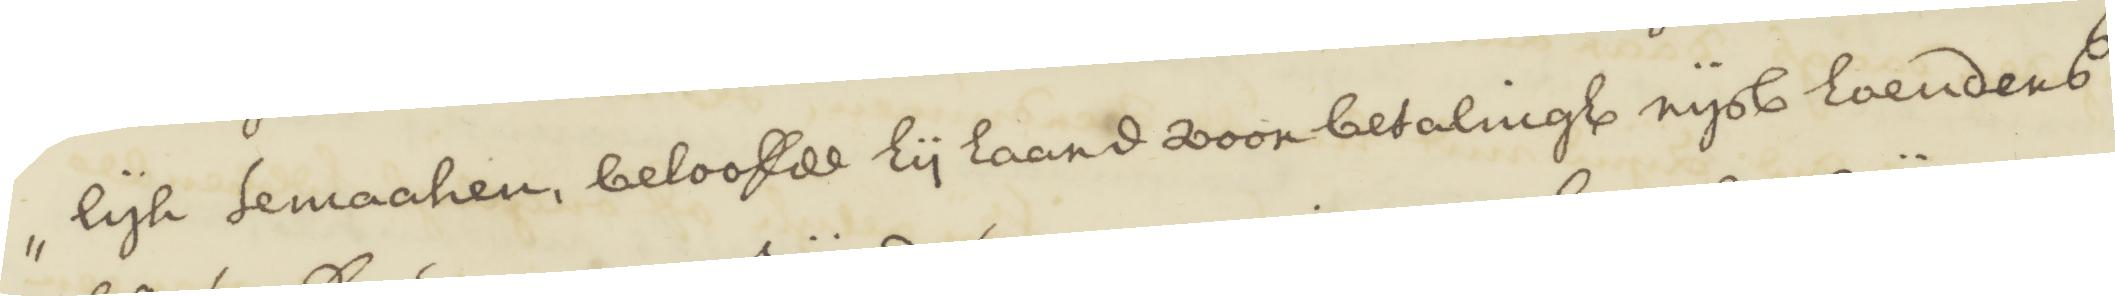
„ lijk temaaken, beloofde hij haare voor betalingh rijst hoenders
